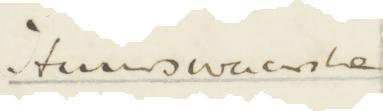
Huurwaarde
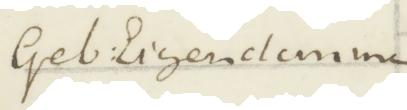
Geb: Eigendomme
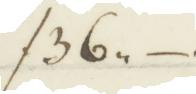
ƒ36„ -
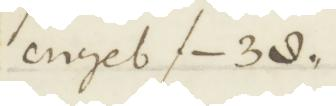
ongeb ƒ - 38 „
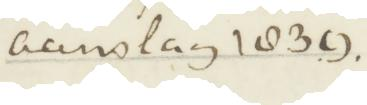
aanslag 1839.
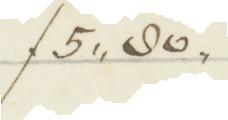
ƒ 5„ 80„
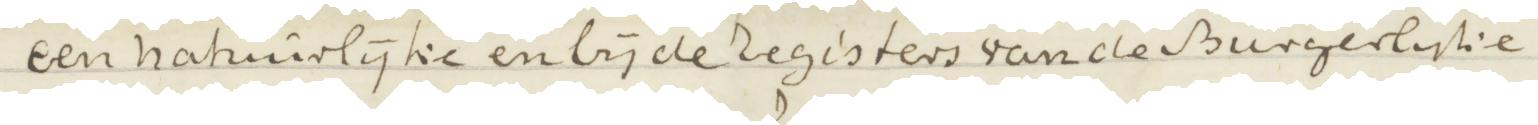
Een natuurlijke en bij de registers van de Burgerlyke
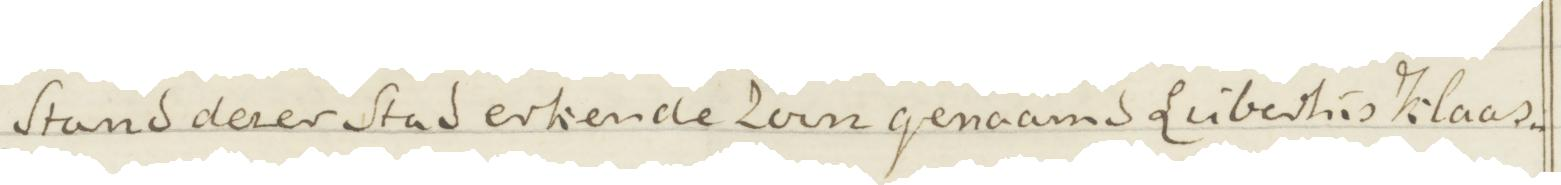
Stand dezer stad erkende Zoon genaamd Lubertus Klaas„
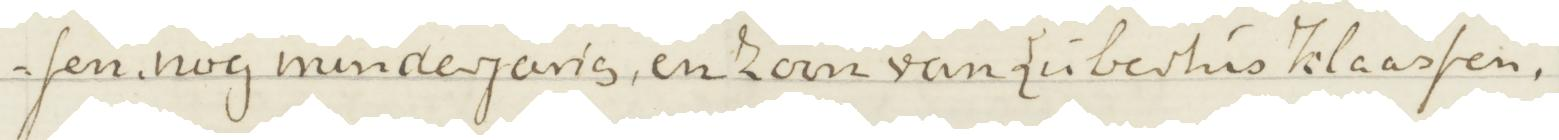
=sen nog minderjarig, en Zoon van Lubertus Klaassen,
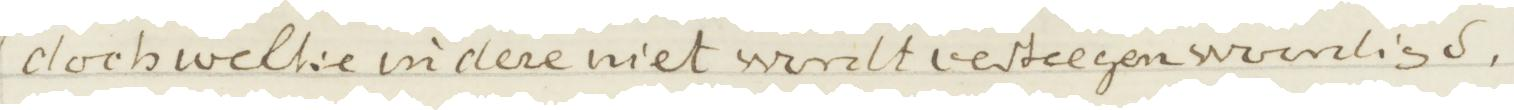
doch welke in deze niet wordt verteegenwoordigd,
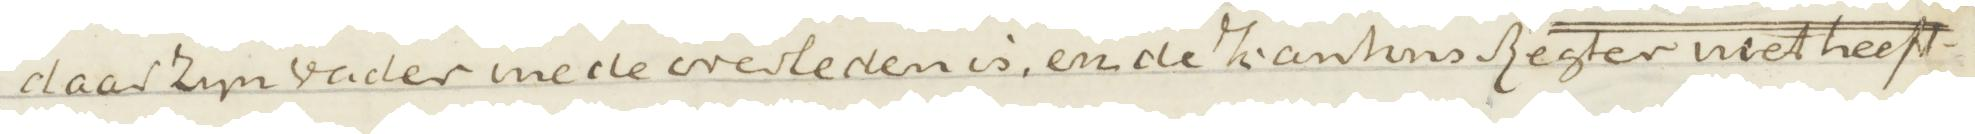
daar Zyn vader mede overleden is, en de Kantons Regter niet heeft
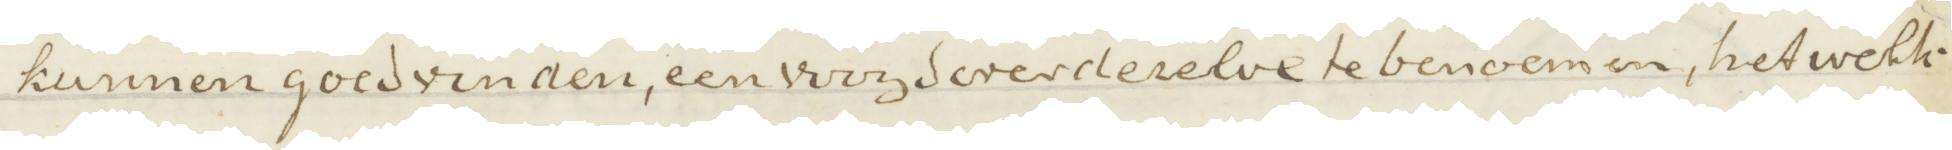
kunnen goed vinden, een voogd over dezelve te benoemen, het welk
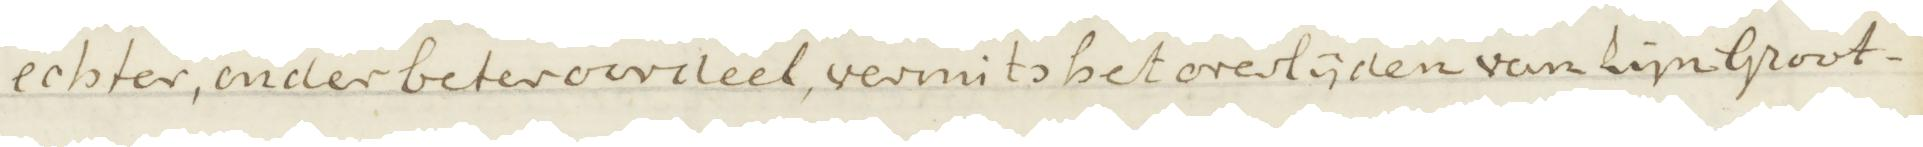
echter, onder beter oordeel, vermits het overlijden van Zijn Groot-
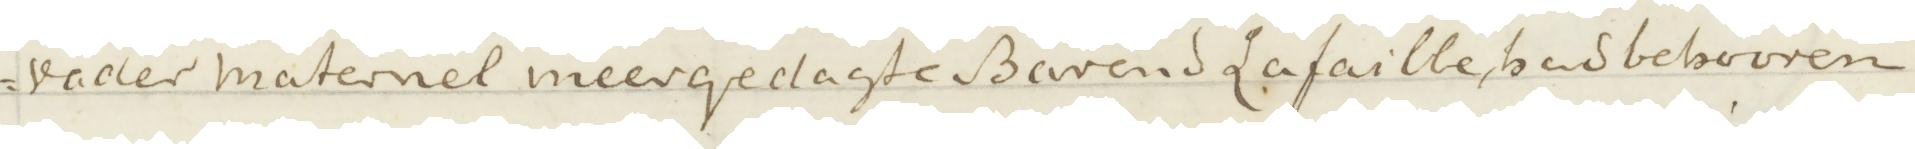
=vader maternel meergedagte Barend Lafaille had behooren
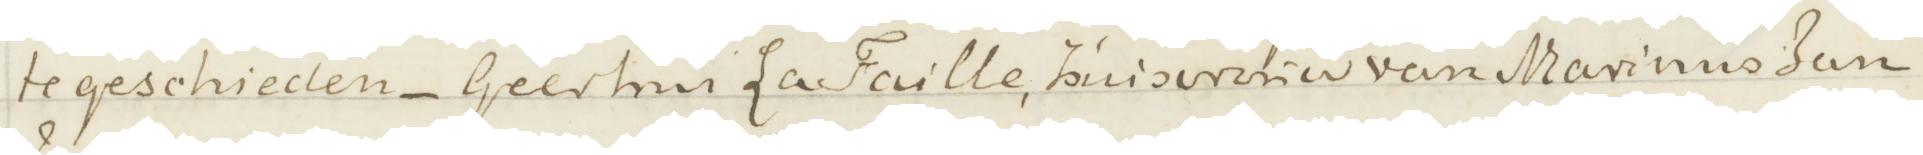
te geschieden - Geertrui La Faille, huisvrouw van Marinus Jan
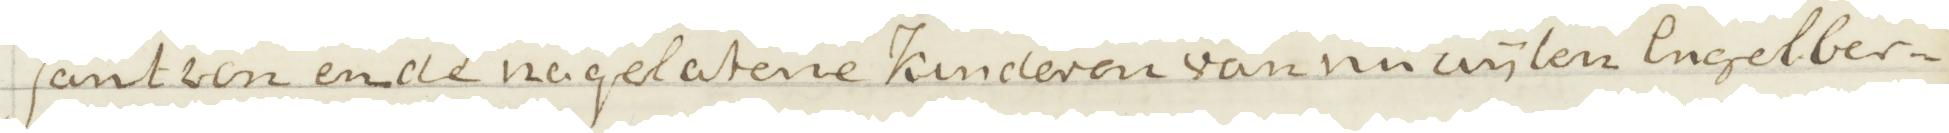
Jantzen en de nagelatene kinderen van nu wijlen Engelber-
